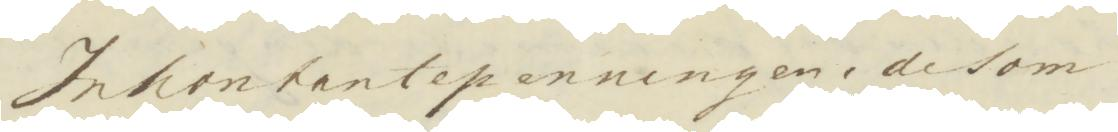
In kontante penningen, de som
